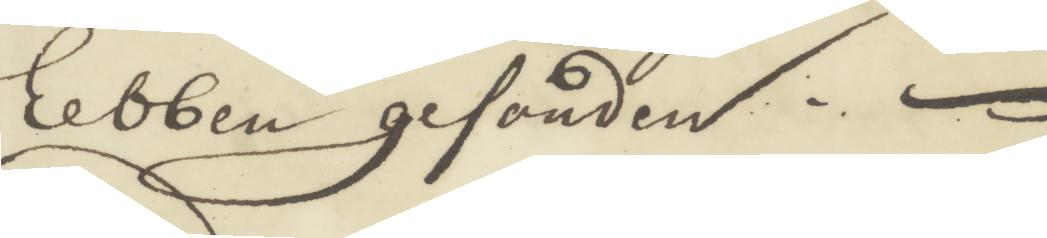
hebben gesonden - .
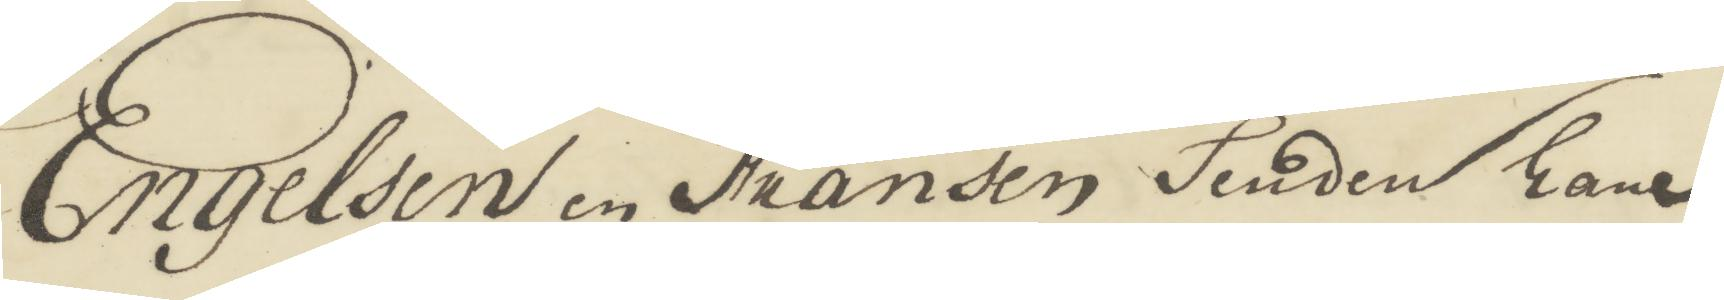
D'Engelsen en Fransen senden hare
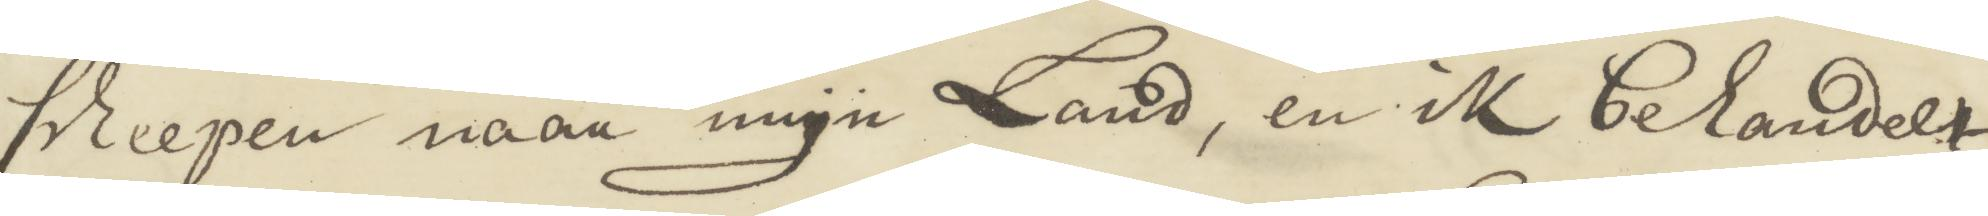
scheepen naar mijn Land, en ik behandelt
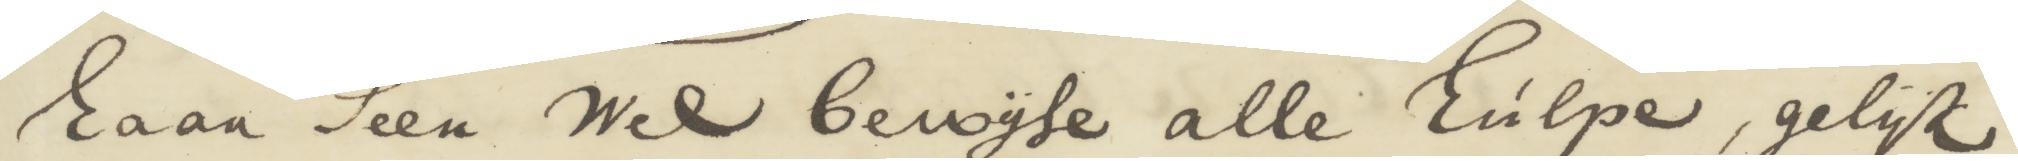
haar seer wel bewijse alle hulpe, gelijk
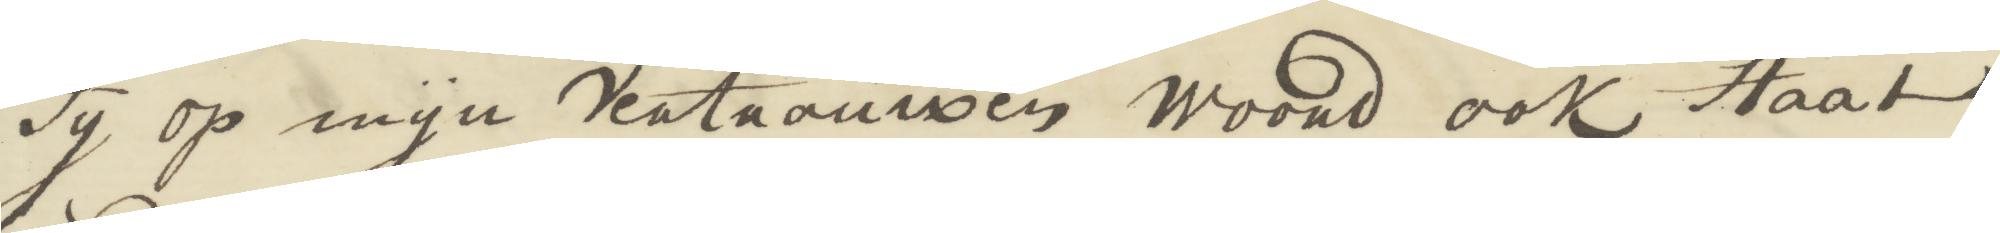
sij op mijn vertrouwen woord ook staat
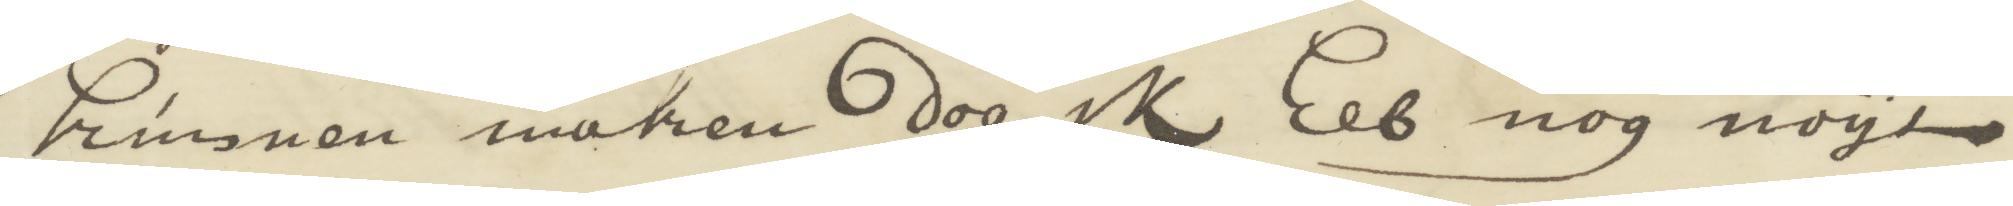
kunnen maken dog ik heb nog noijt
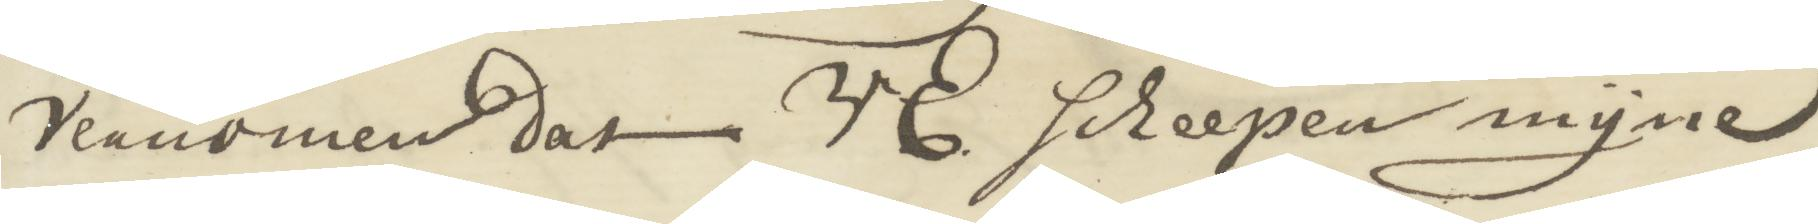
vernomen dat VE. scheepen mijne
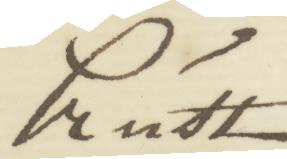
kust
